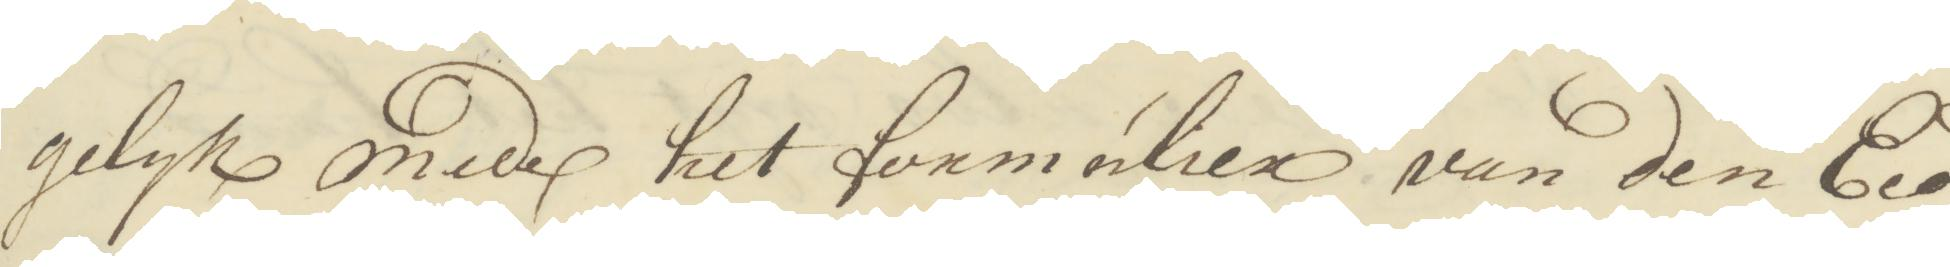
gelyk mede het formulier van den Eed
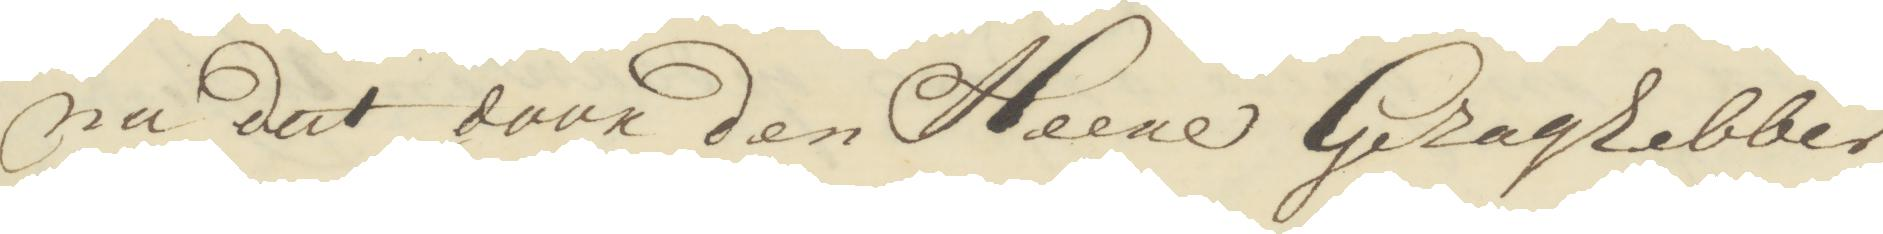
na dat door den Heere Gezaghebber
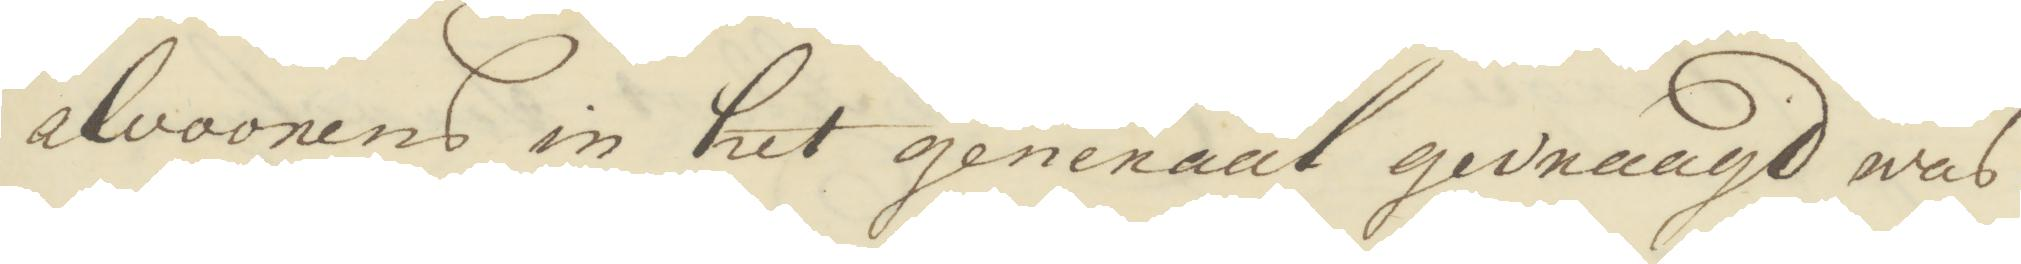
alvoorens in het generaal gevraagd was
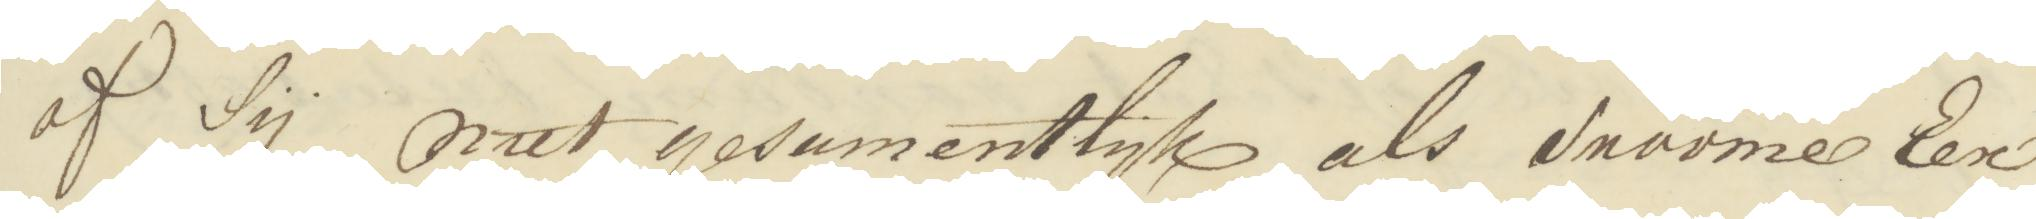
of sij met gesamentlijk als vroome Eer
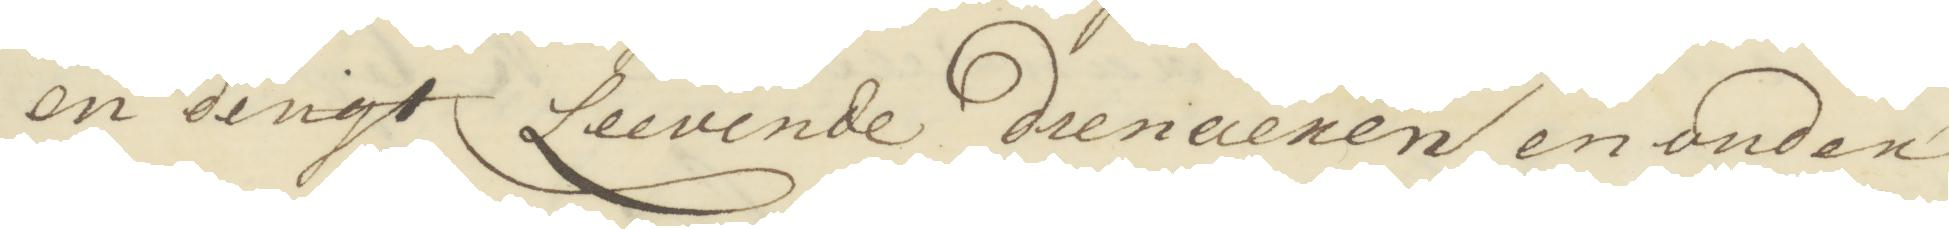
en deugt Leevende dienaeren en onder
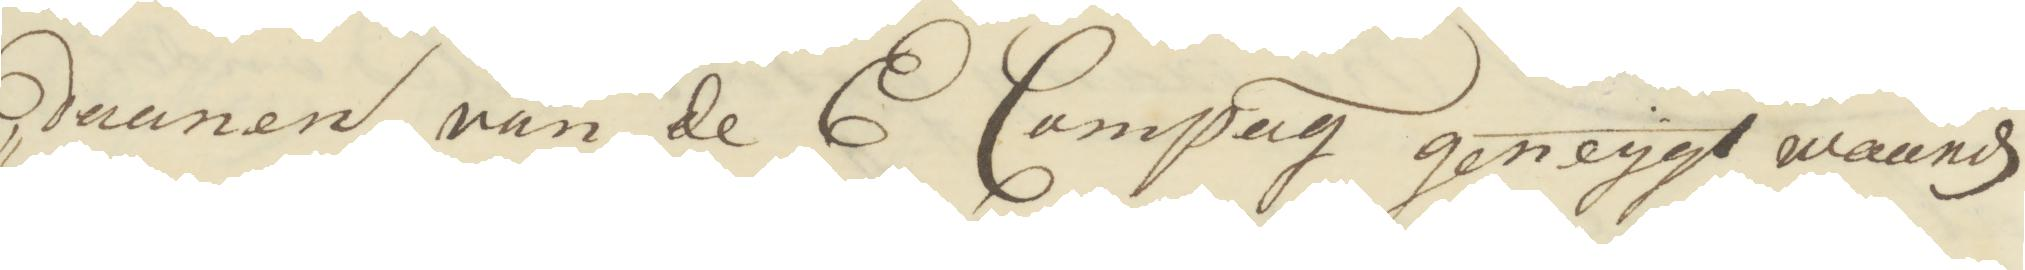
„daanen van de E Compag geneijgt waaren
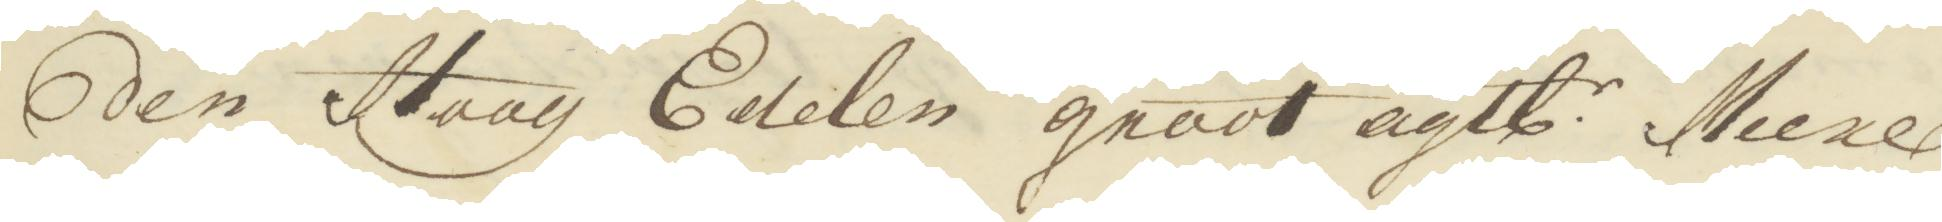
den Hoog Edelen groot agtb:r Meere
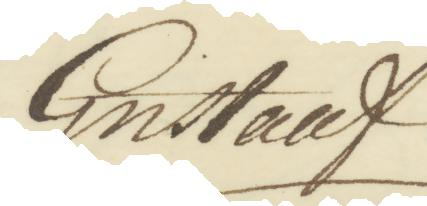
Gustaaf
